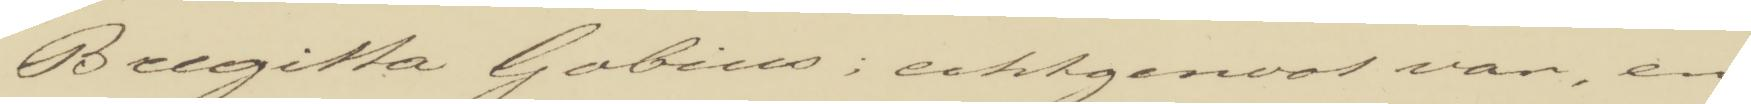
Bregitta Gobius; echtgenoot van, en
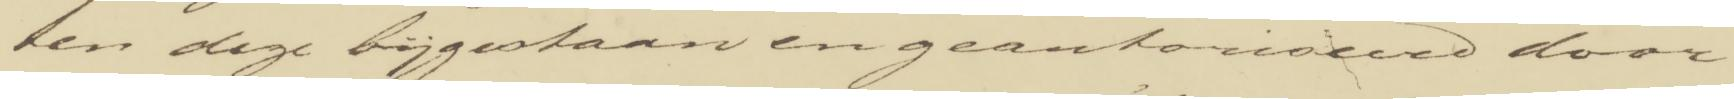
ten deze bijgestaan en geautoriseerd door
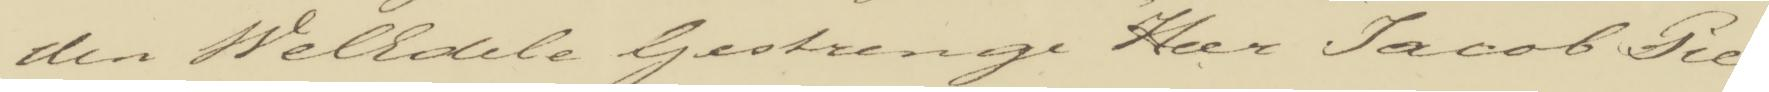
den WelEdele Gestrenge Heer Iacob Pie
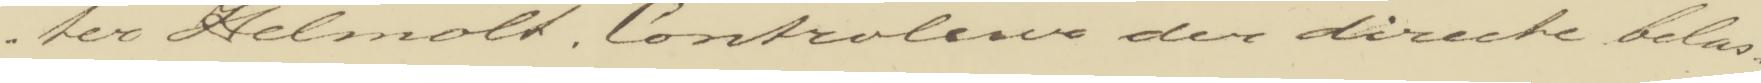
„ter Helmolt, Controleur der directe belas
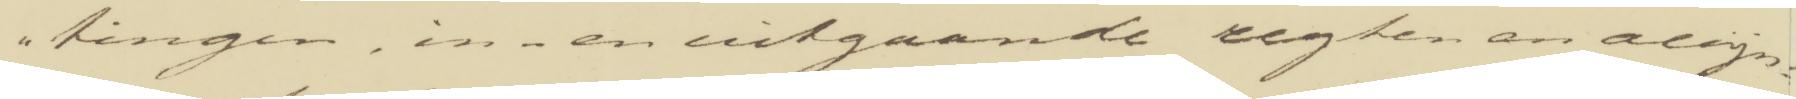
„tingen, in - en uitgaande regten en acsijn
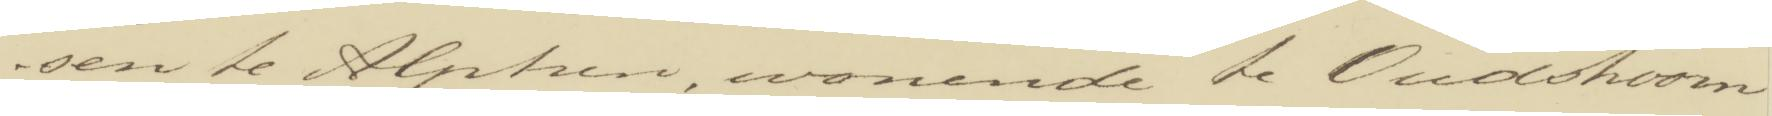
„sen te Alphen, wonende te Oudshoorn
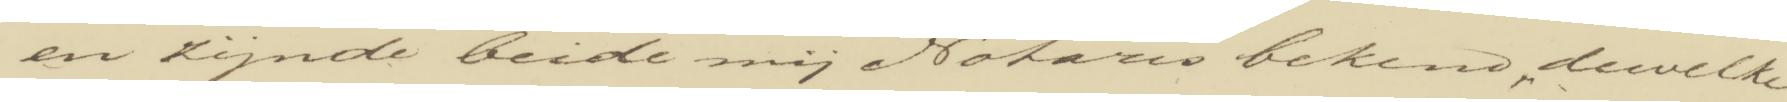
en zijnde beide mij Notaris bekend, dewelke
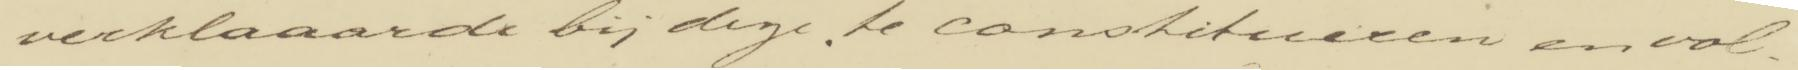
verklaaarde bij deze te constitueren en vol„
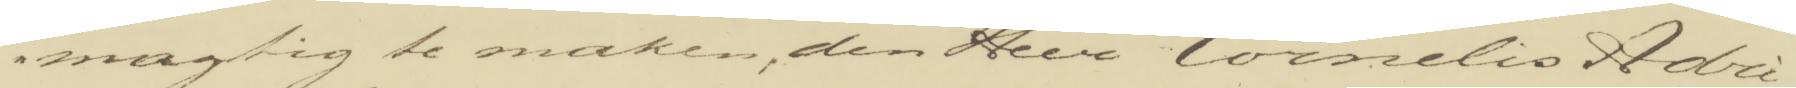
„magtig te maken, den Heer Cornelis Adri
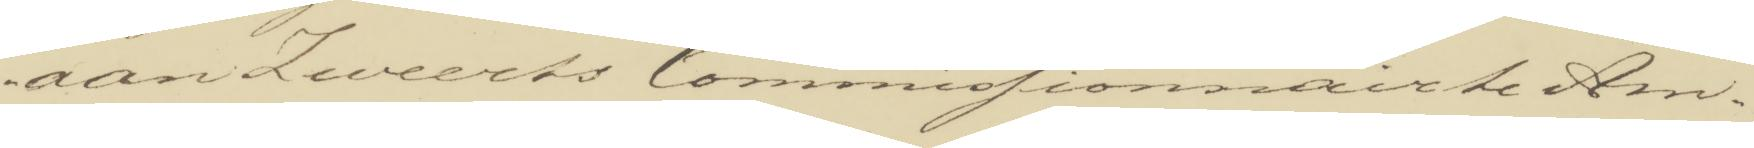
„aan Zweerts Commissionnair te Am„
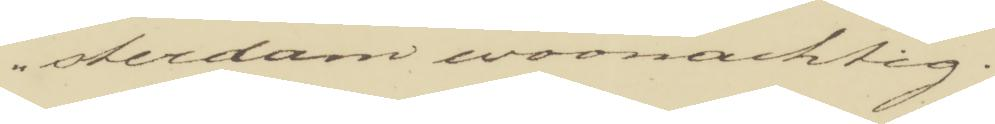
„sterdam woonachtig
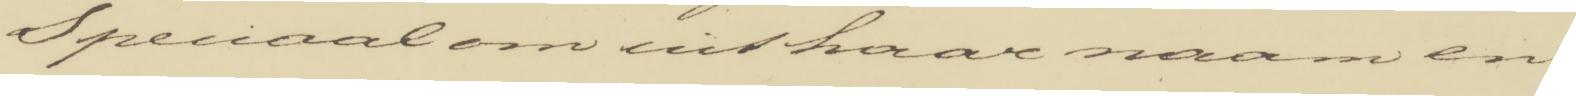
Speciaal om uit haar naam en
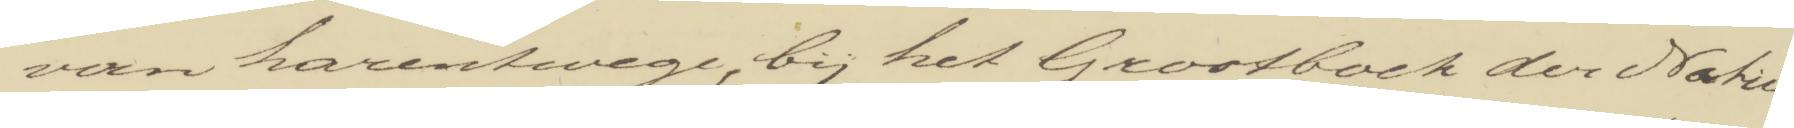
van harentwege, bij het Grootboek der Natio
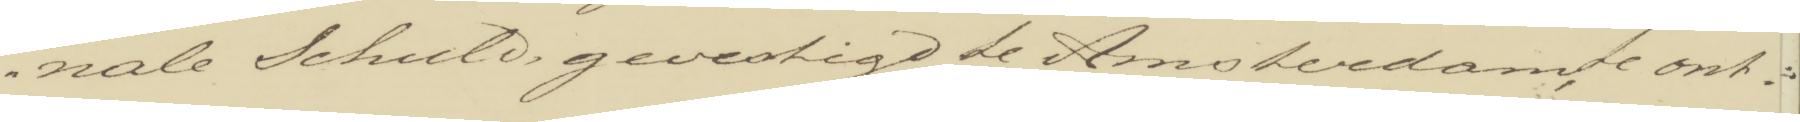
„nale schuld, gevestigd te Amsterdam, te ont„
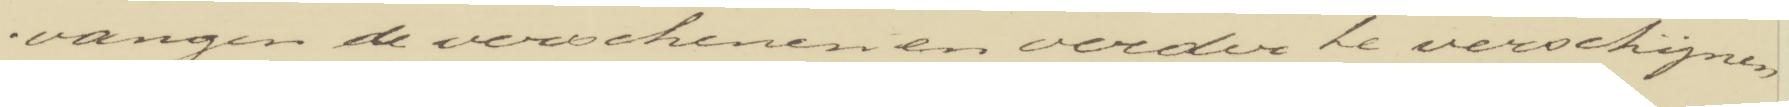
„vangen de verschenen en verder te verschijnen
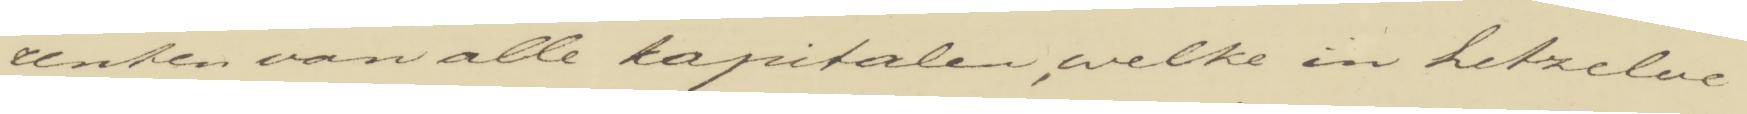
renten van alle kapitalen, welke in hetzelve
